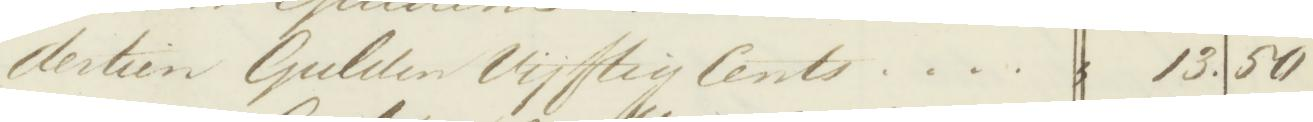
dertien Gulden vijftig Cents . . . . „ 13.50
